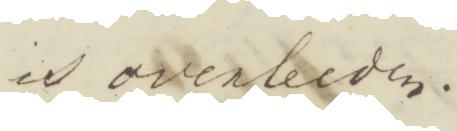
is overleeden.
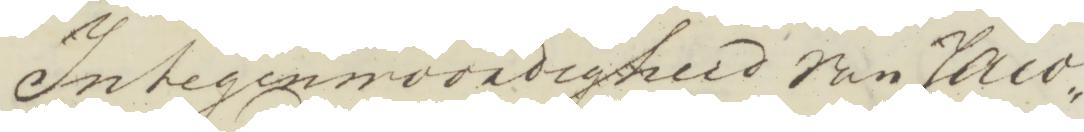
Jntegenwoordigheid van Jaco„
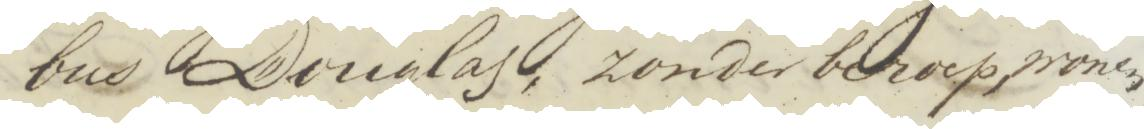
=bus Douglas, zonder beroep, wonen
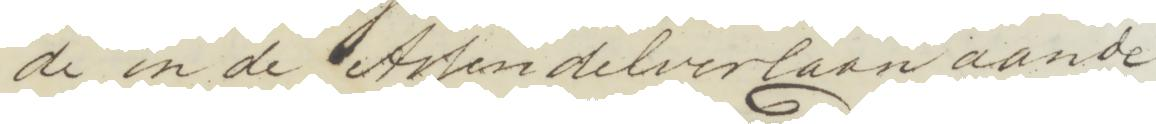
=de in de Assendelverlaan aan de
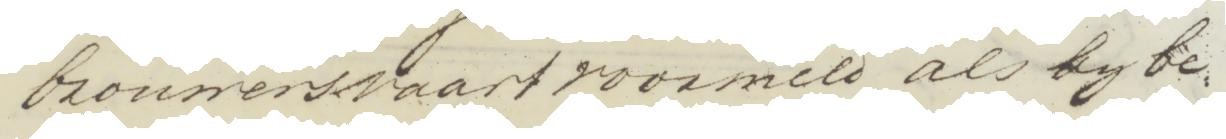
brouwersvaart voormeld, als by be:
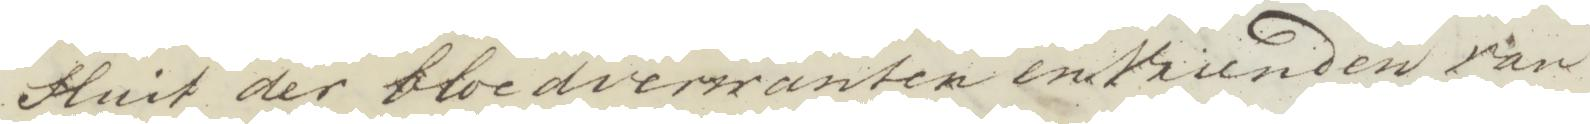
=sluit der bloedverwanten en vrienden van
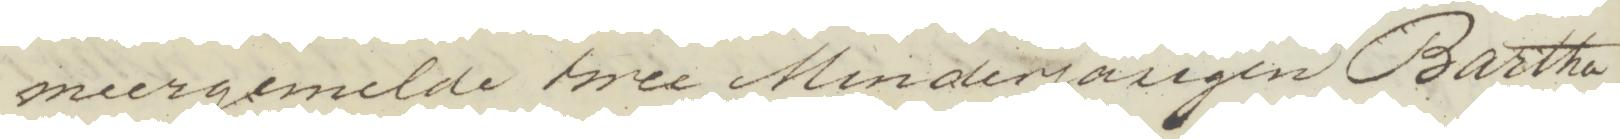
meergemelde twee Minderjarigen Bartha
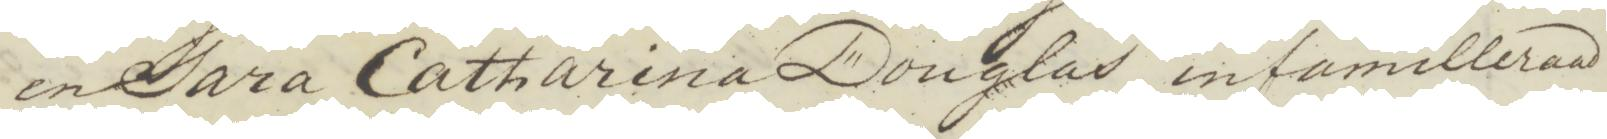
en Sara Catharina Douglas, in familleraad
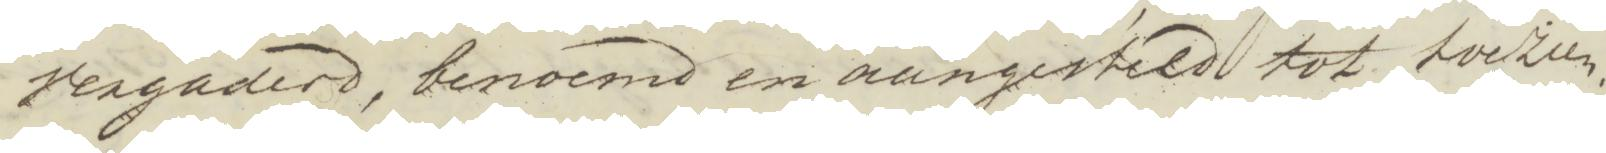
vergaderd, benoemd en aangesteld tot toezien,
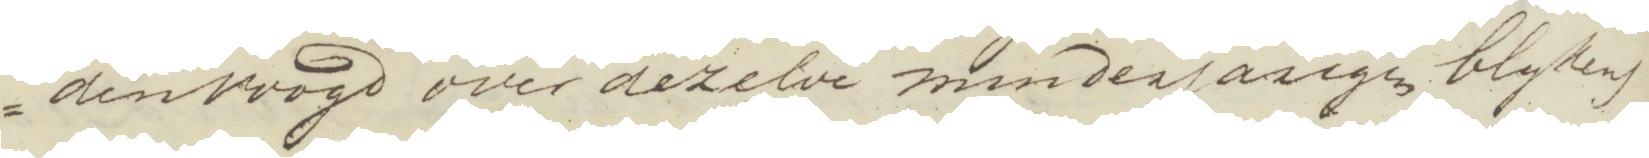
=den voogd over dezelve minderjarigen blykens
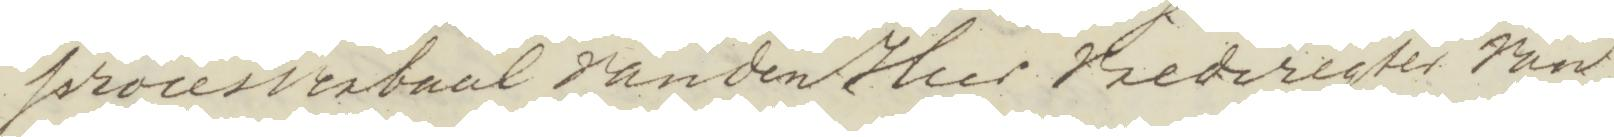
procesverbaal van den Heer Vrederegter van
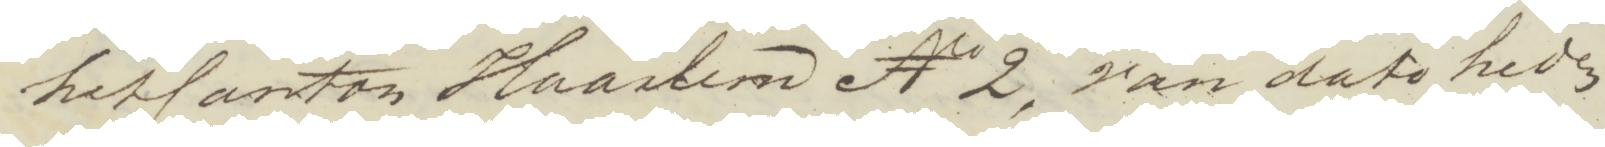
het Canton Haarlem No 2, van dato heden
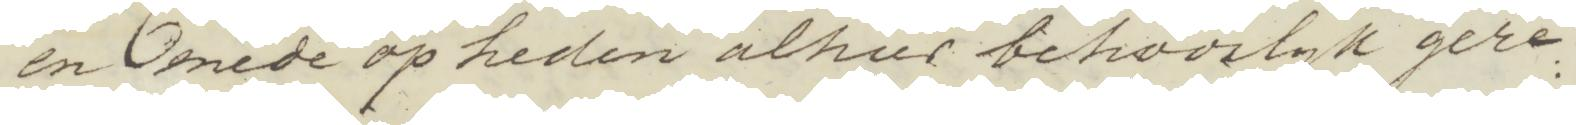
en mede op heden alhier behoorlyk gere:
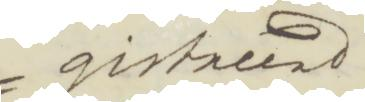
=gistreerd
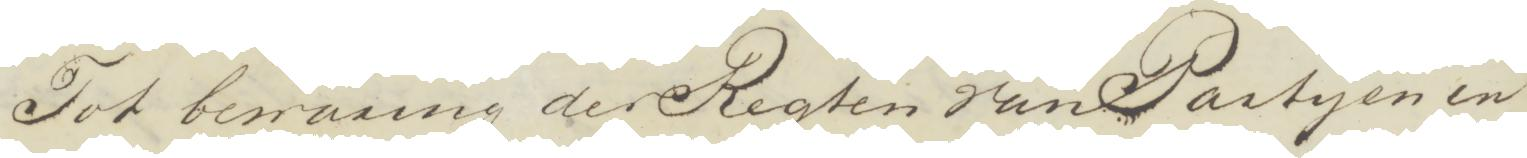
Tot bewaring der Regten van Partyen en
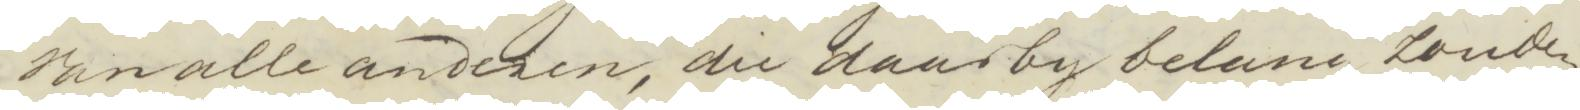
van alle anderen, die daar by belang zouden
